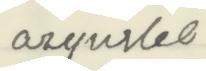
azynstel
